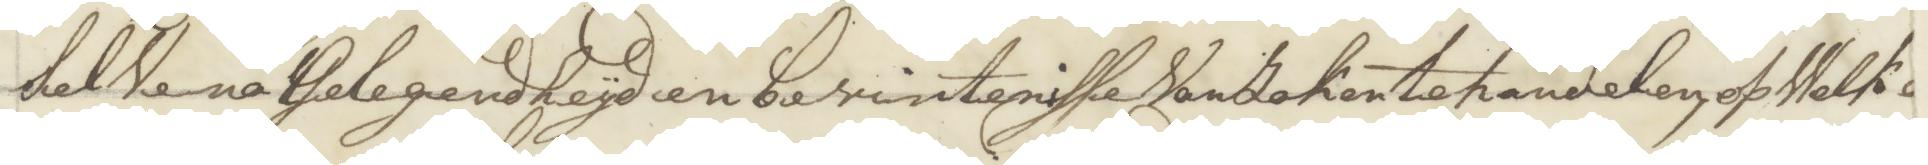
selve na Gelegendheijd en bevintenisse van zaken te handelen op welk
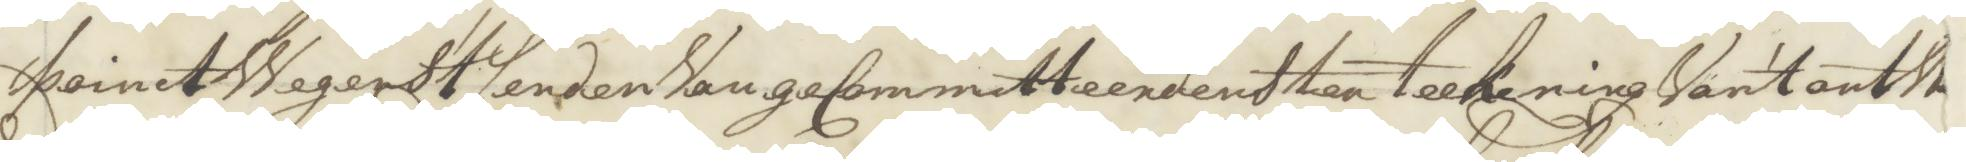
poinct wegens't senden van gecommitteerdens ter teekening van’t antw
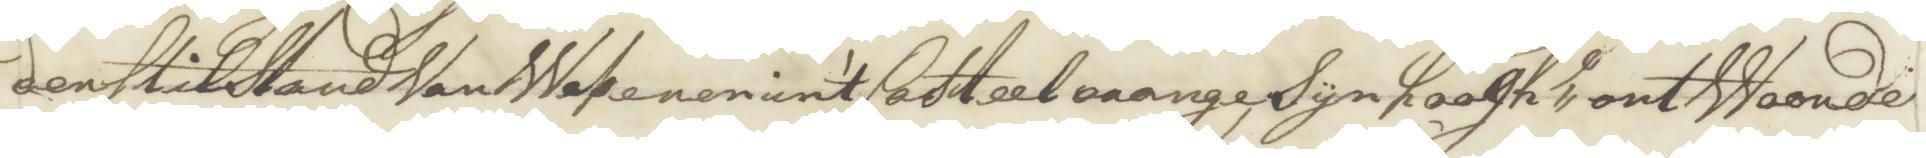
den stilstand van wapenen in't Casteel orange sijn hoogh„d antwoorde
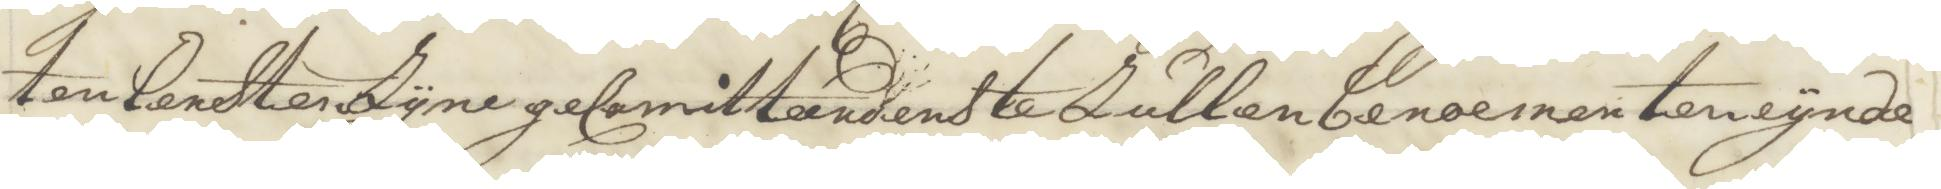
ten Eersten zijne gecomitteerdens te zullen benoemen ten eijnde
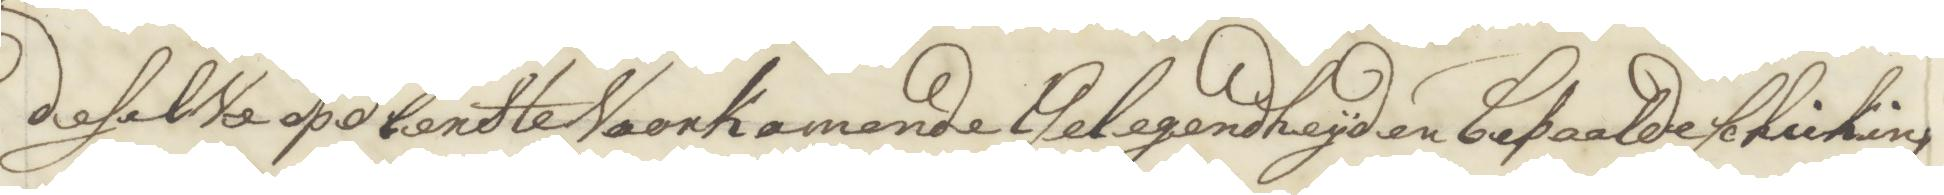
deselve op d'Eerste voorkomende Gelegendheijd en bepaalde schicking
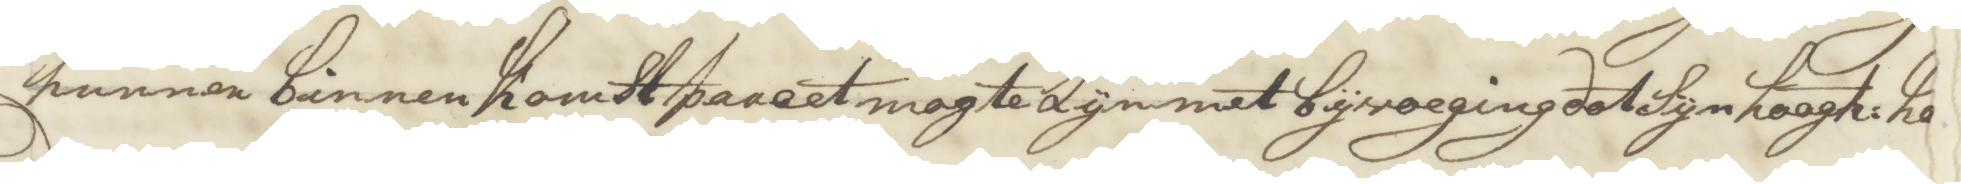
hunnen binnen komst paraet mogte zijn met bijvoeging dat sijn hoogh: h
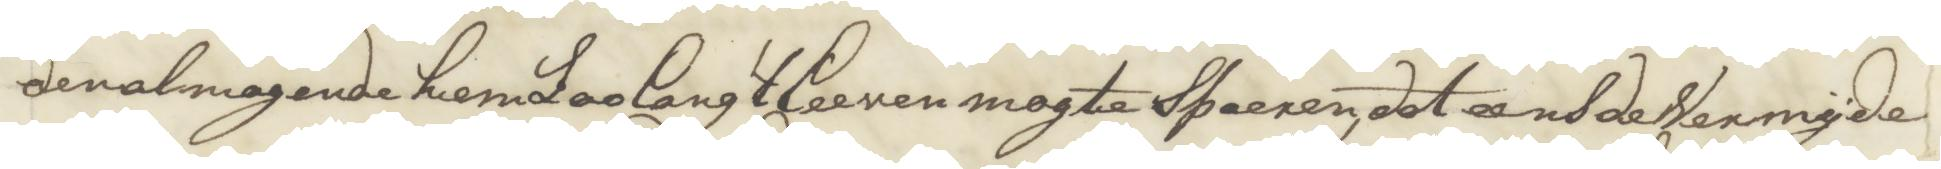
den almogende hem zoo lang 't leeven mogte spaeren, dat eens de verwijde
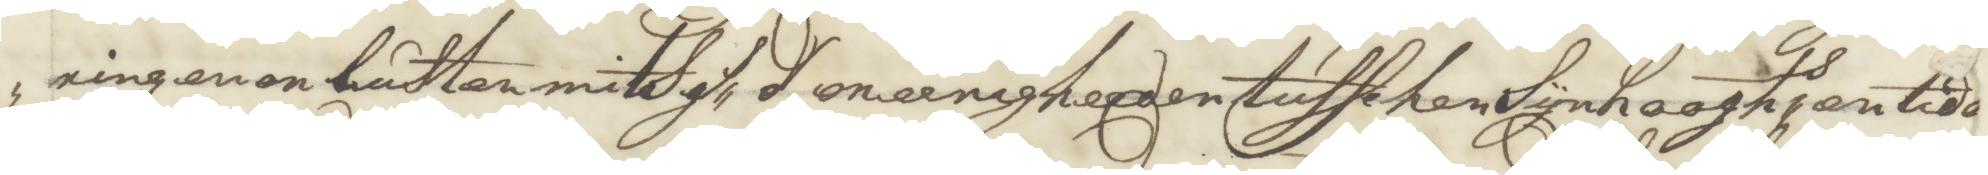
„ring en onlusten mitsg„s d’oneenigheeden tusschen sijn hoogh„s en tid
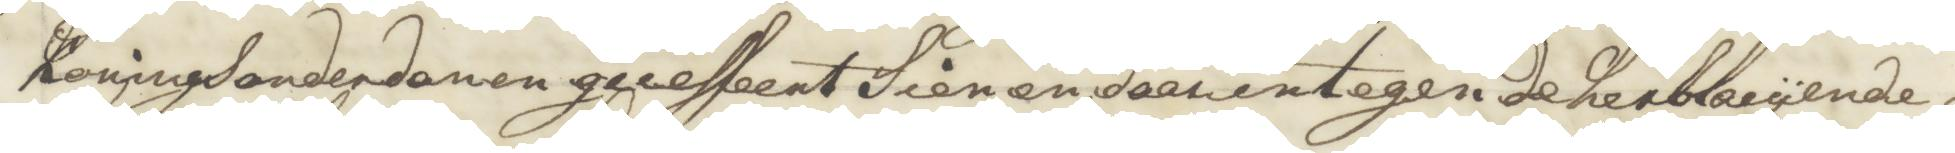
konings onderdanen gecesseert sien, en daarentegen de herbloeijende
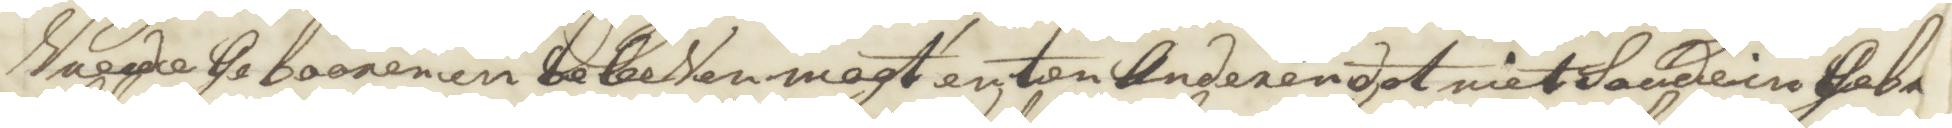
vrede gebooren en beleeven mogt en ten anderen dat niet soude in Gebr
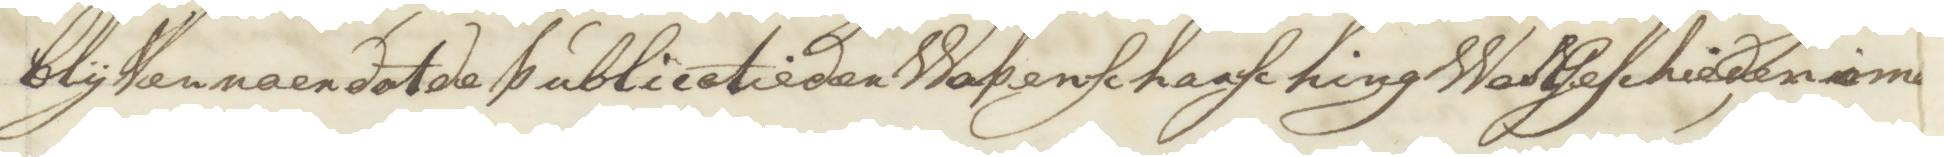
blijven naer dat de publicatie der wapenschorsching was geschieden om
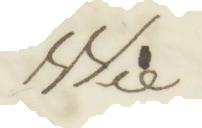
wie
